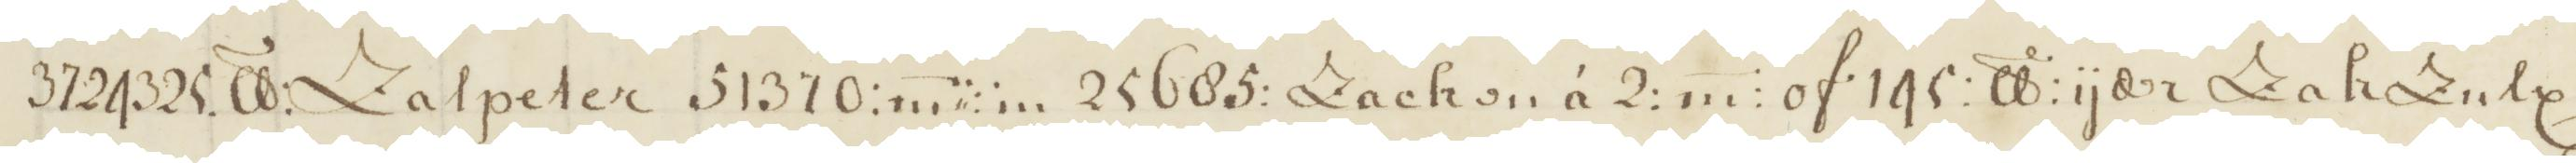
3724325. lb: Zalpeter 51370: m„n in 25685: zacken á 2: m: of 145: lb:e ijder zak zulx
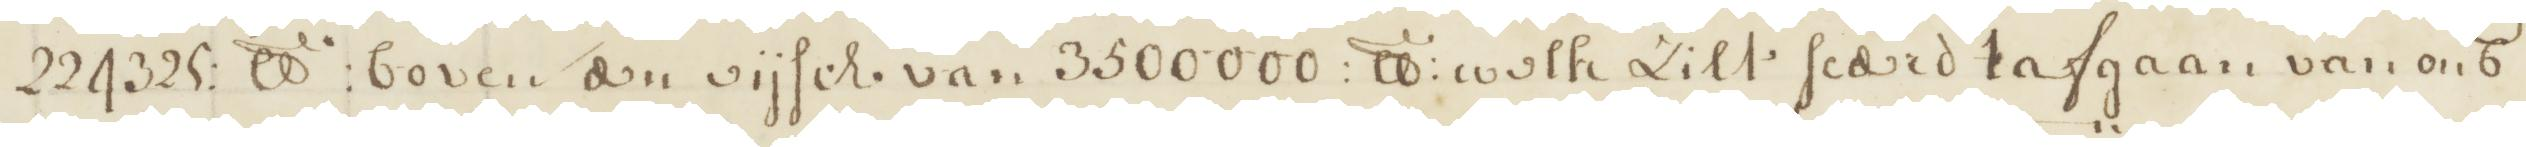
224325: lb:e boven den eijsch van 3500000: lb:e welk zilt sederd t afgaan van ons
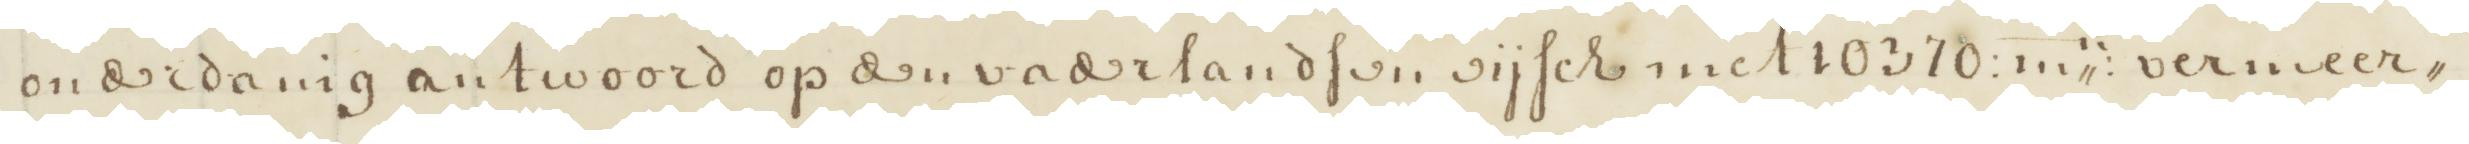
onderdanig antwoord op den vaderlandsen eijsch met 10370: m„n: vermeer„
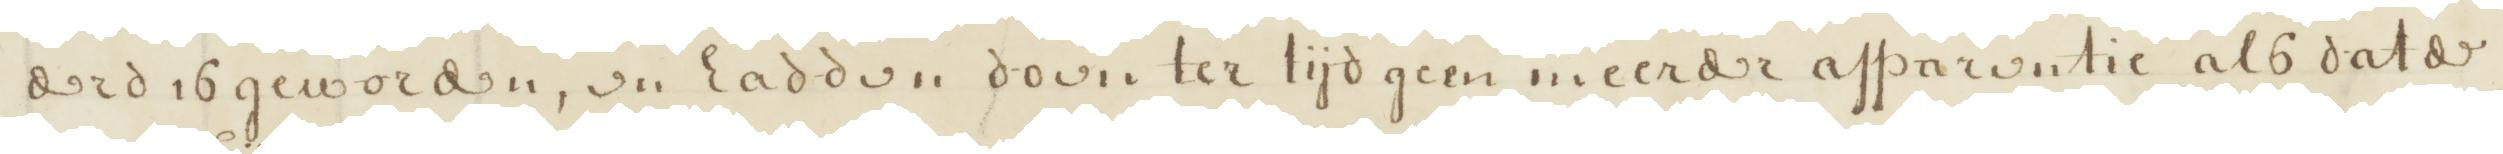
derd is geworden, en hadden doen ter tijd geen meerder apparentie als dat de
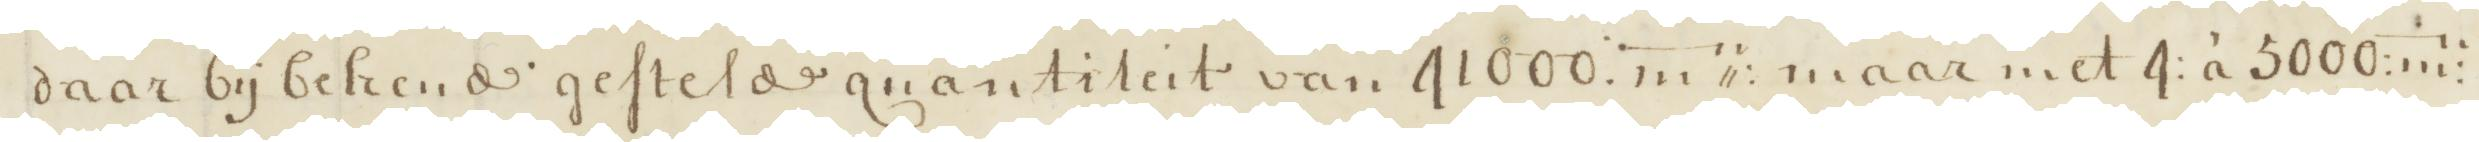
daar bij bekende gestelde quantiteit van 41000: m„n: maar met 4: â 5000: m:n
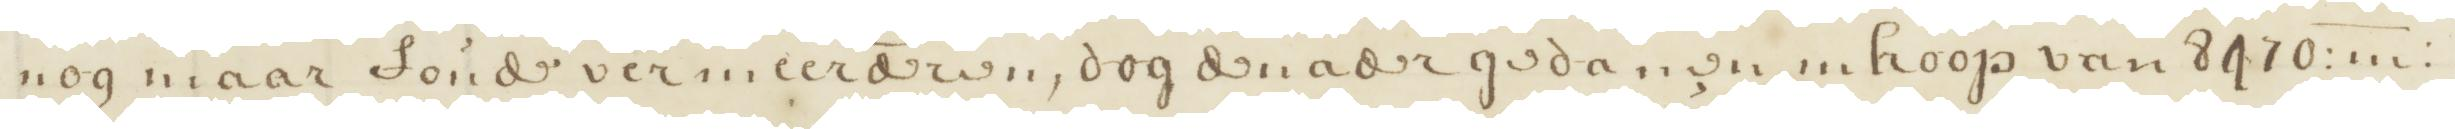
nog maar soude vermeerderen, dog de nader gedanen inkoop van 8470: m:
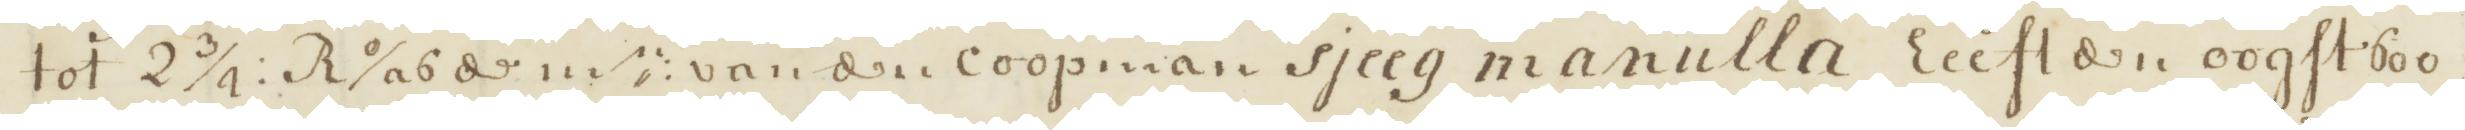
tot 2¾: R/oas de m„n: van den Coopman sjeeg manulla heeft den oogst soo
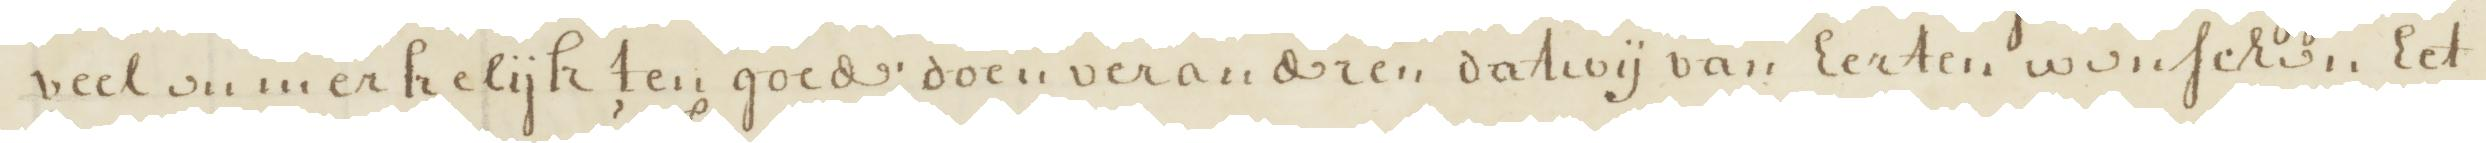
veel en merkelijk ten goede doen veranderen dat wij van herten wenschen het
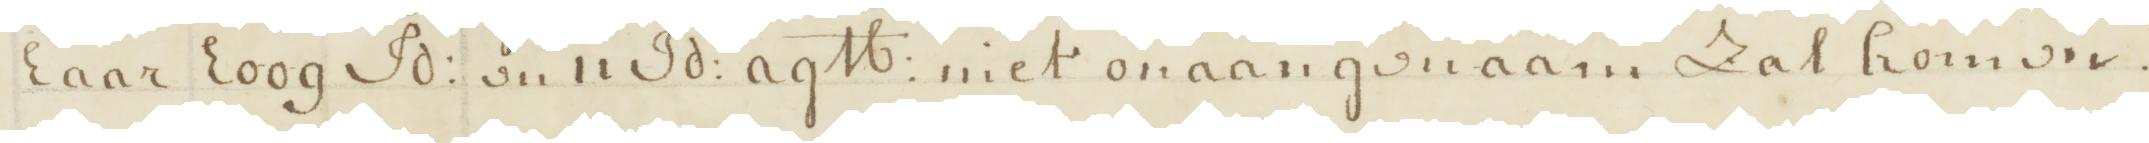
haar hoog Ed: en: u Ed: agtb: niet onaangenaam zal komen
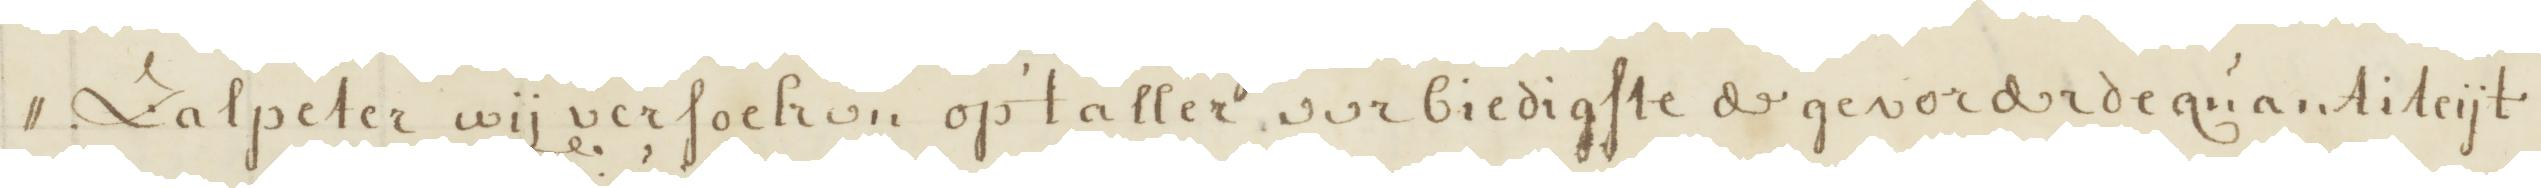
„ Zalpeter wij versoeken op 't aller eerbiedigste de gevorderde quantiteijt
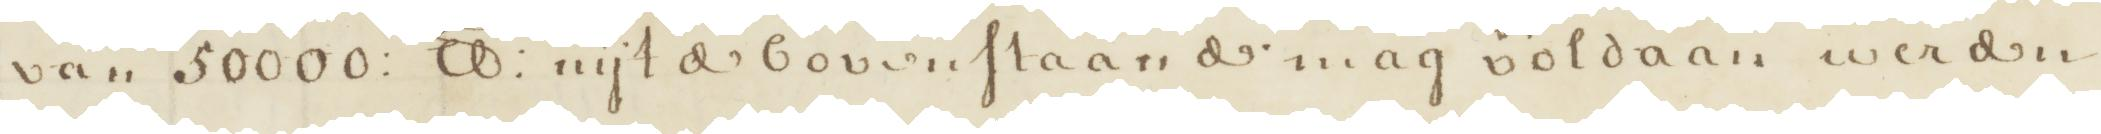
van 50000: lb:e uijt de bovenstaande mag voldaan werden
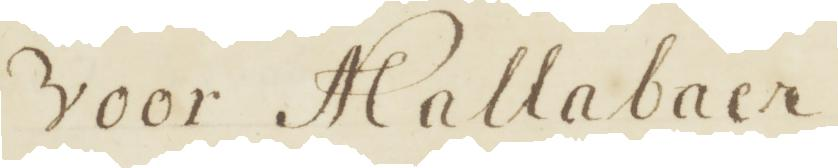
voor Mallabaer
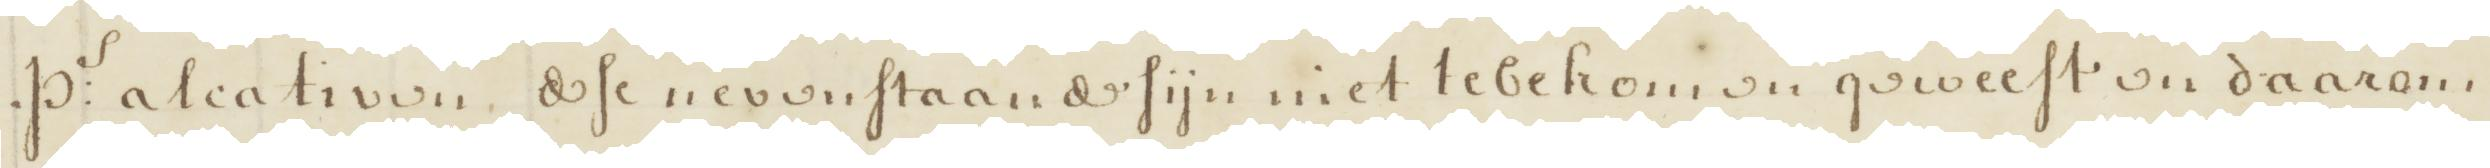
- p:s alcativen dese nevenstaande sijn niet te bekomen geweest en daarom
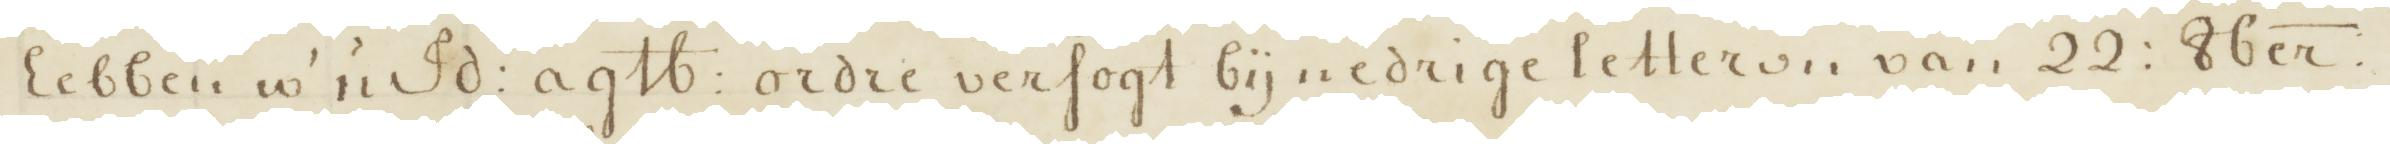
hebben w' u Ed: agtb: ordre versogt bij nedrige letteren van 22: 8ber:
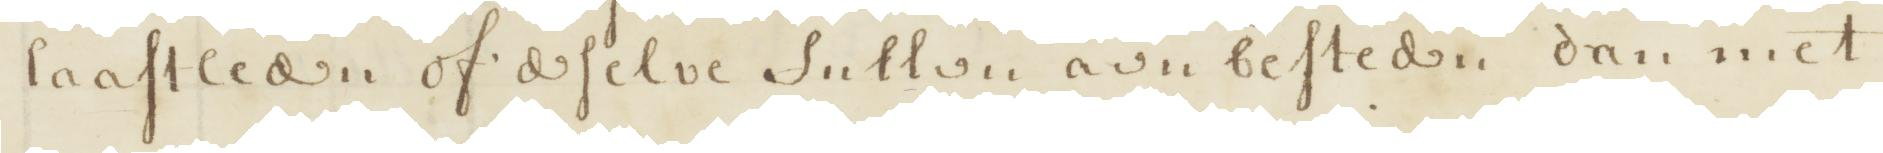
laastleden of deselve sullen aen besteden dan met
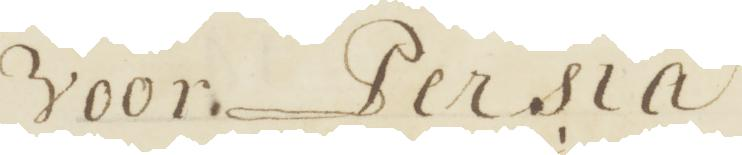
Voor Persia
